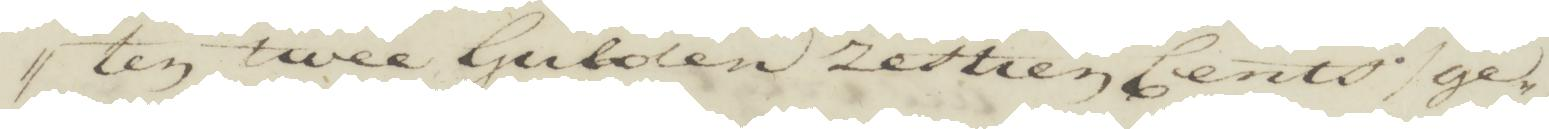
„ ten twee Gulden zestien Cents / ge„
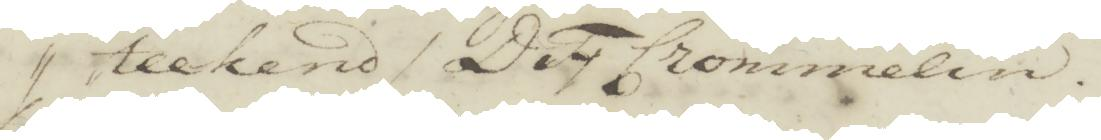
„ teekend / DF Crommelin.
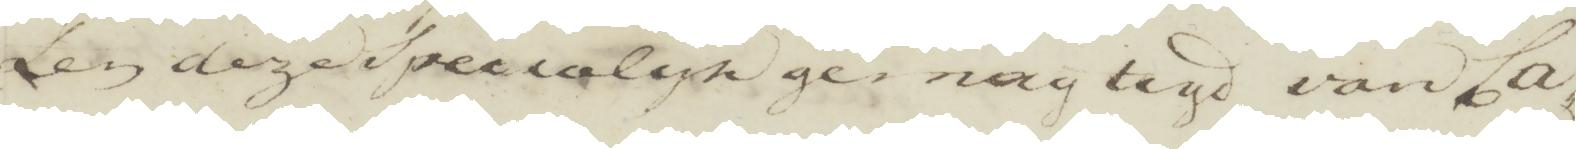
ten deze specialyk gemagtigd van Ca
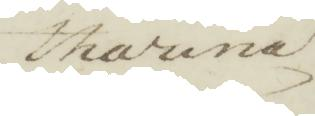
tharina
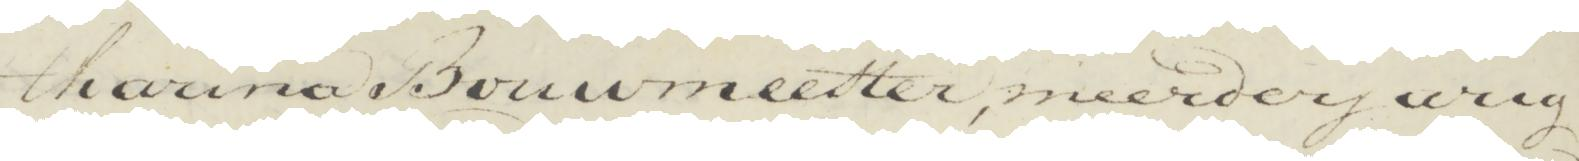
tharina Bouwmeester, meerderjarig
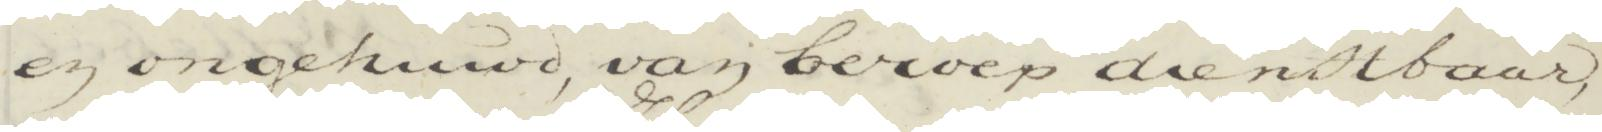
en ongehuwd, van beroep dienstbaar,
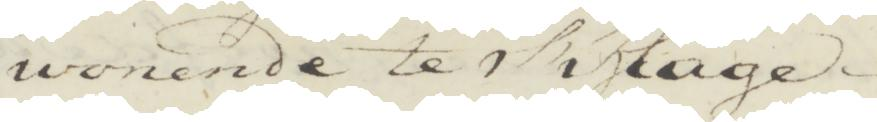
wonende te s'Hage
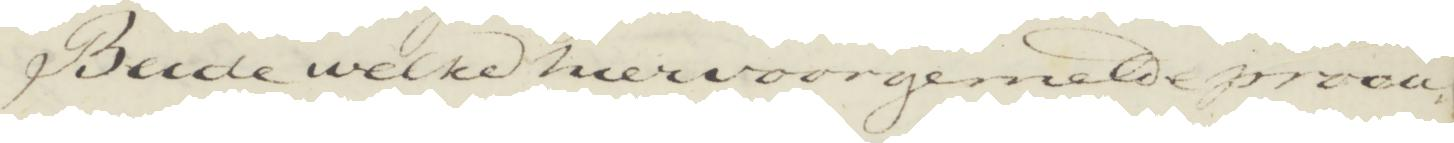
Beide welke hiervoorgemelde procu„
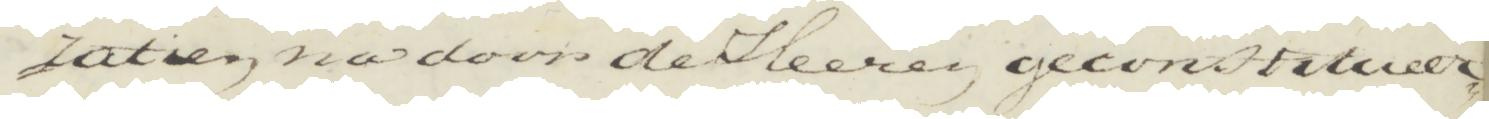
ratien na door de Heeren geconstitueer„
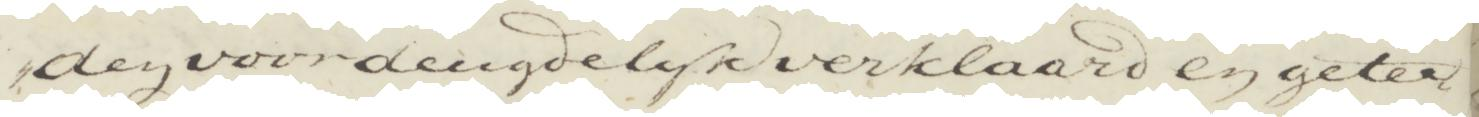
„den voor deugdelyk verklaard en getee
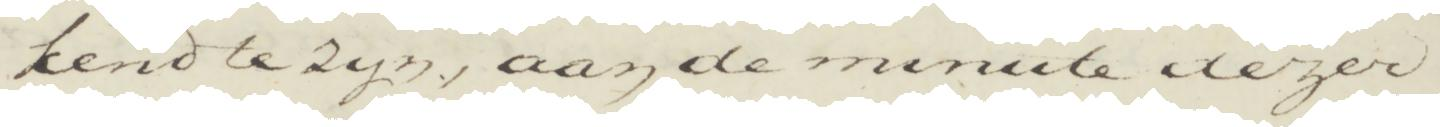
kend te zyn, aan de minute dezer
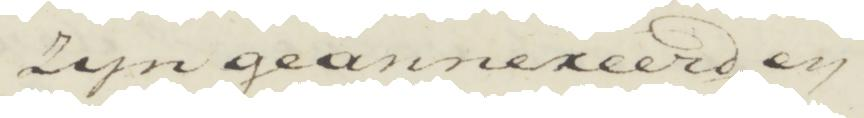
zyn geannexeerd en
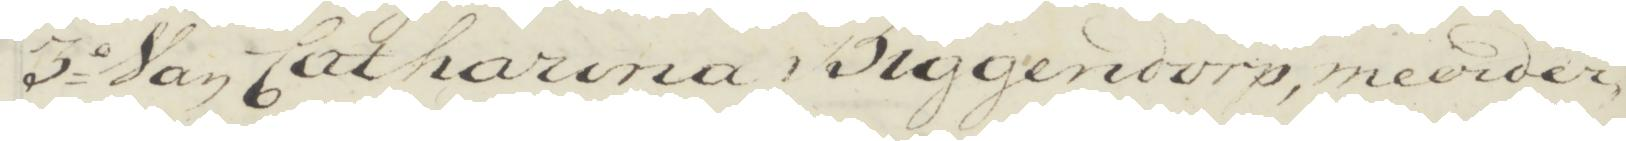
3=o Van Catharina Biggendorp, meerder„
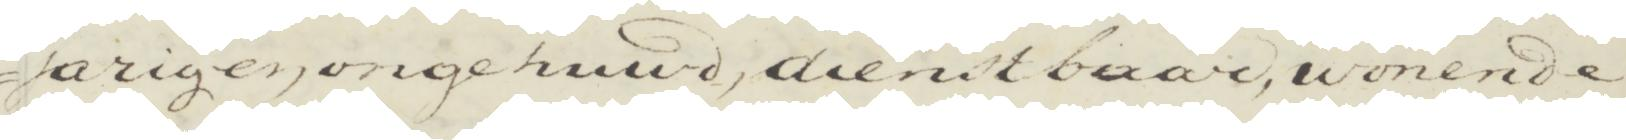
=jarig en ongehuwd, dienstbaar, wonende
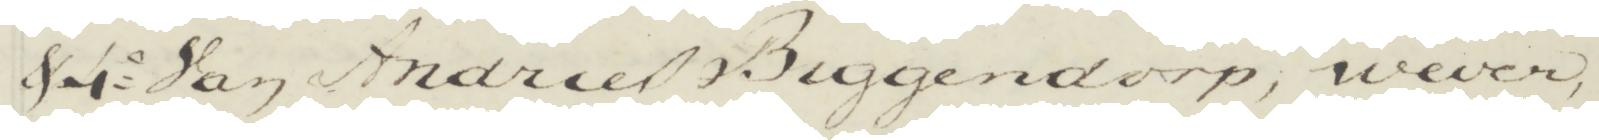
& 4=o Van Andries Biggendorp; wever,
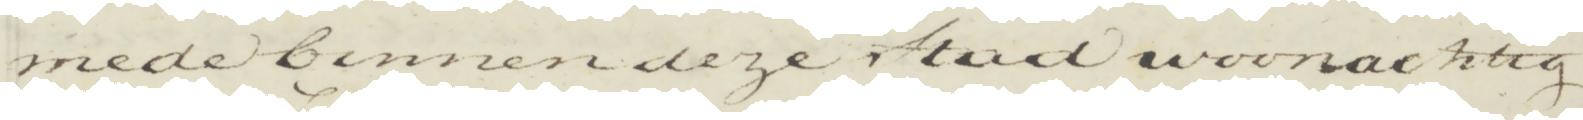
mede binnen deze stad woonachtig
